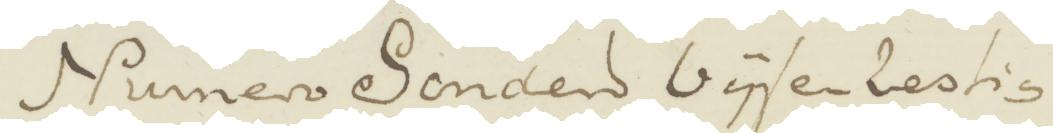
Numero Honderd Vijf en Zestig
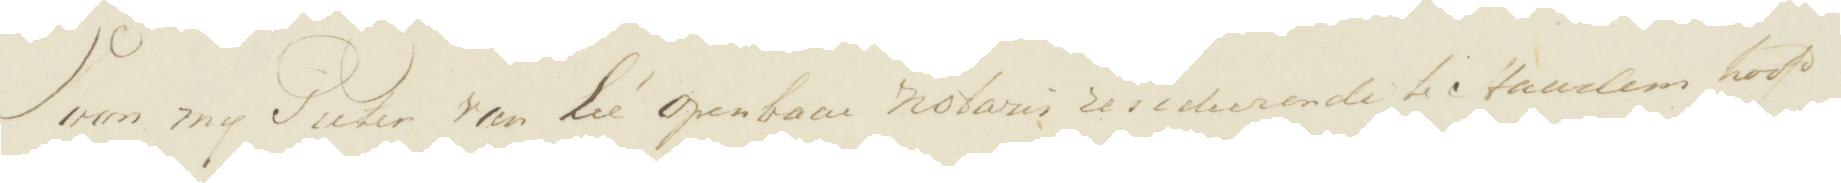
Voor my Pieter van Leé Openbaar Notaris resideerende te Haarlem hoofd
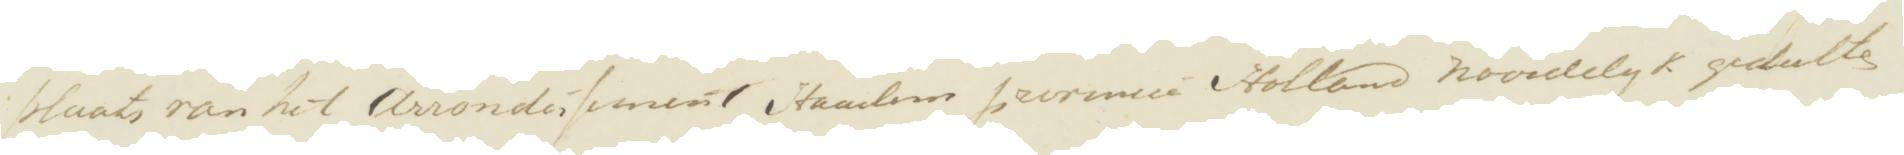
plaats van het Arrondesiment Haarlem provincie Holland noordelyk gedeelte
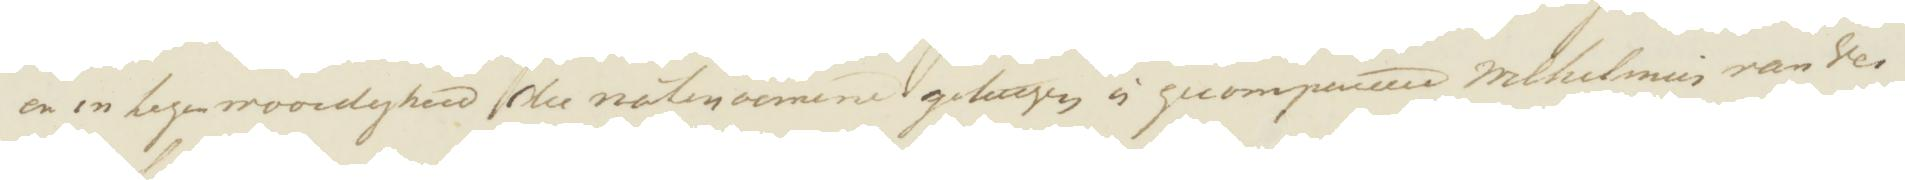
en in tegenwoordigheid die natenoemene getuigen is gecompareerd Wilhelmus van Ves
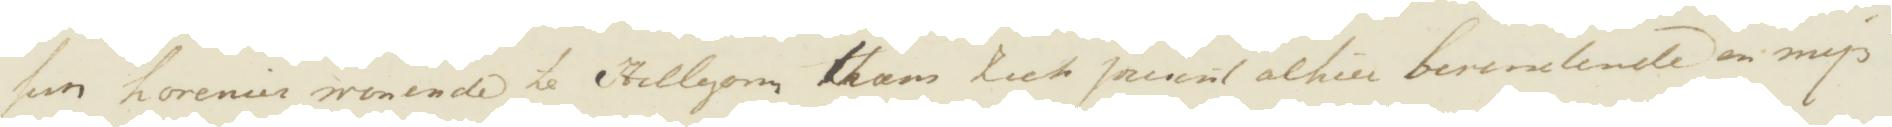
sem hovenier wonende te Hillgom thans zich present alhier bevindende en mijn
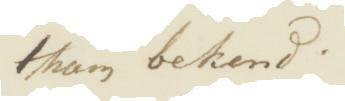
thans bekend.
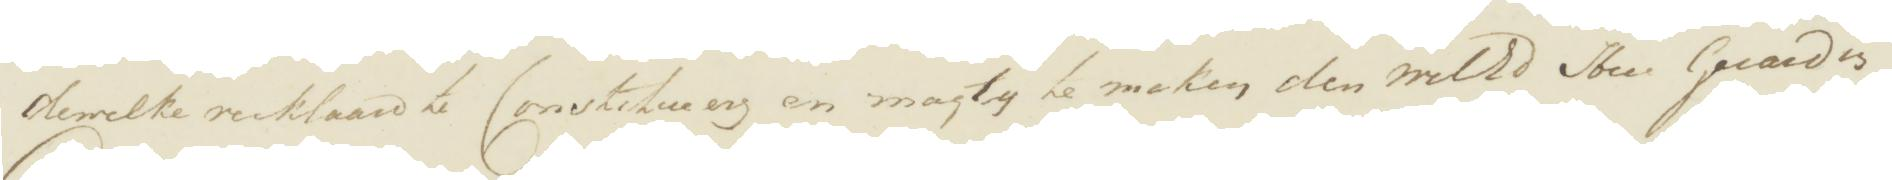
dewelke verklaard te Constitueeren en magtig te maken den welEd Heer Gerardis
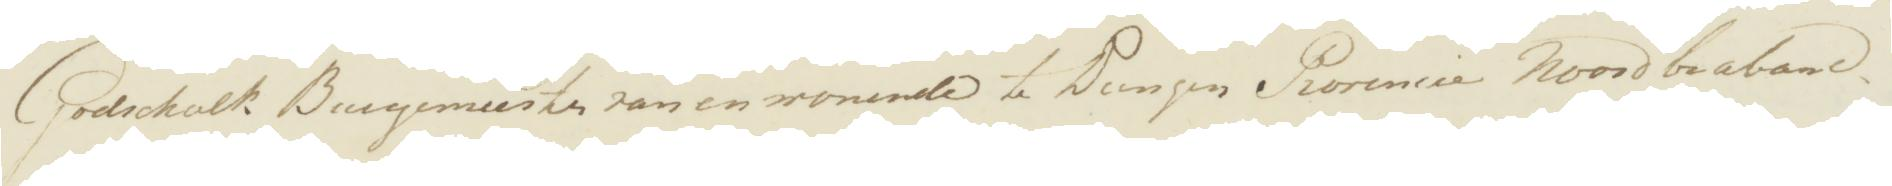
Godschalk Burgemeester van en wonende te Dongen Provincie Noord braband,
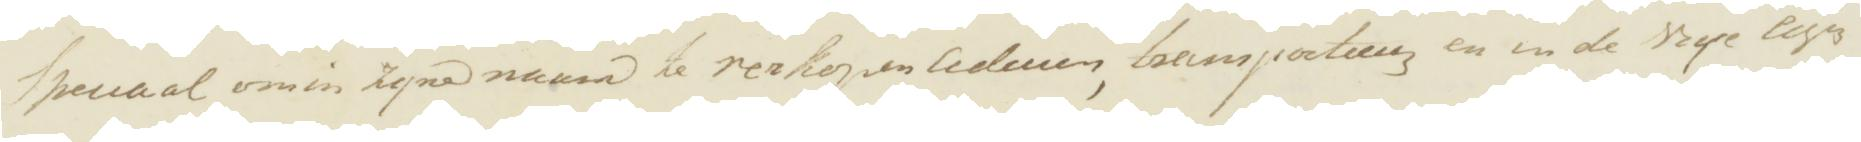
speciaal om in zyne naam te verkopen en te doen transporteeren in de vrye eigen
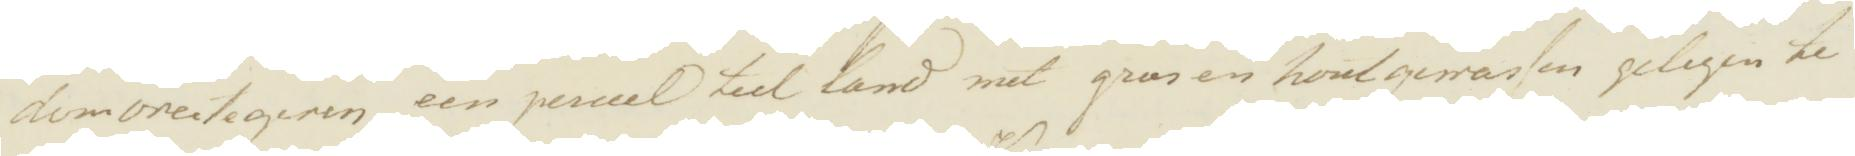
dom overtegeven, een perceel teel land met gras en hout gewassen gelegen te
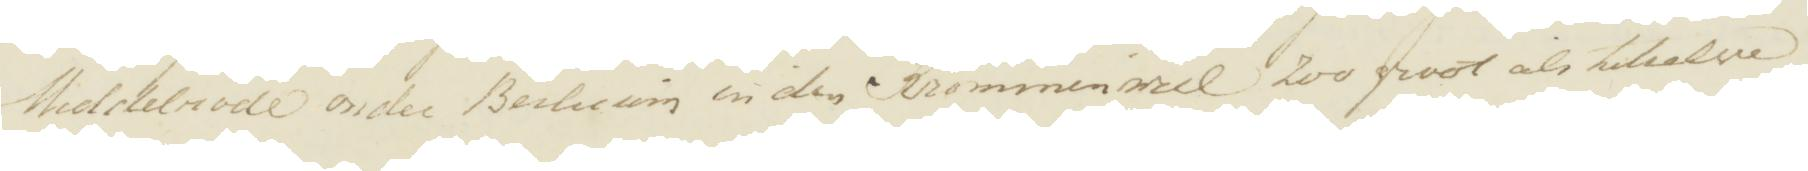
Middelrode onder Berlicum in den Krommenwal zoo groot als hetzelve
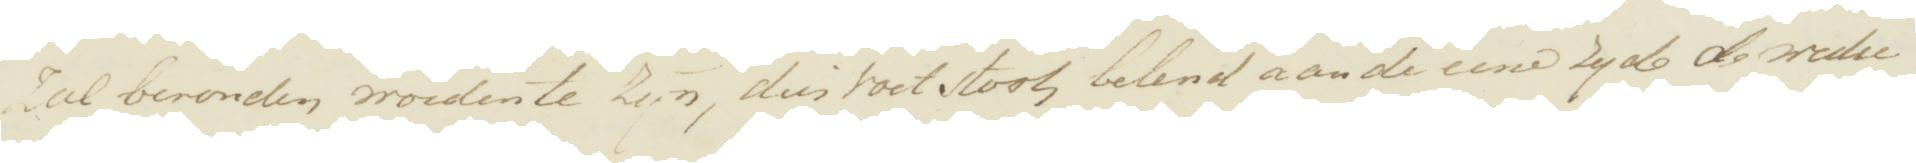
zal bevonden worden te zyn, dien voet stoot, belend aan de eene zyde de wedu
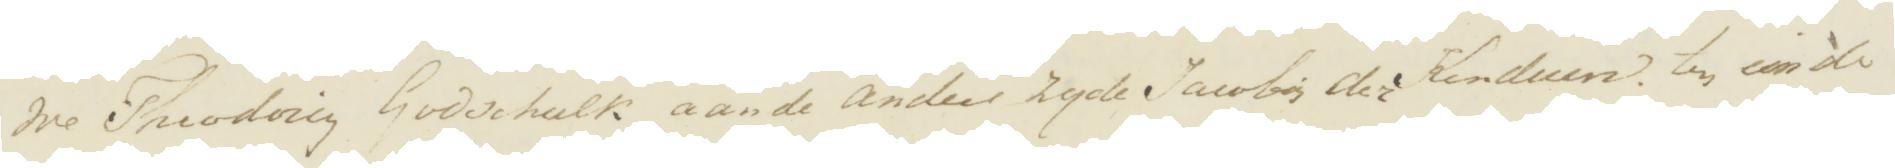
we Theodoric Godschalk, aan de andere zyde Jacobus der Kinderen, ten einde
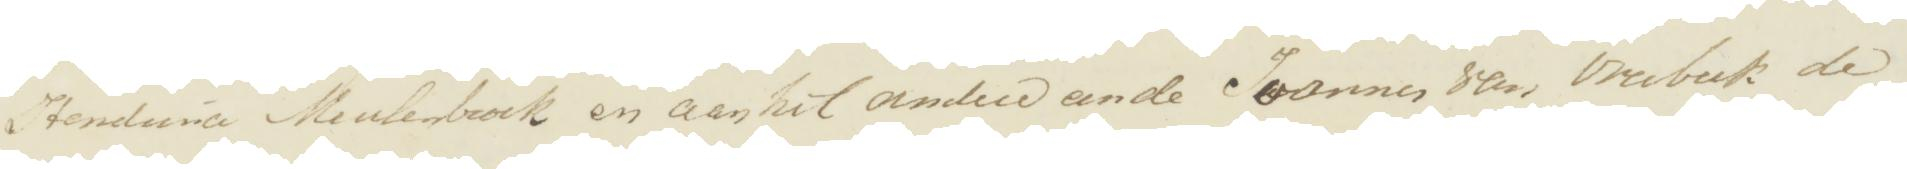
Hendrina Meulenbroek en aan het andere einde Joannes van Overbeek, de
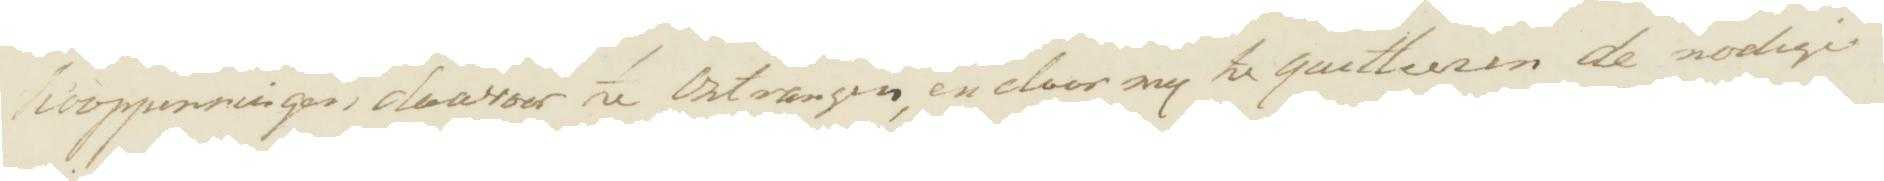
Kooppenningen, daarvoor te Ontvangen, en door my te quitteeren de nodige
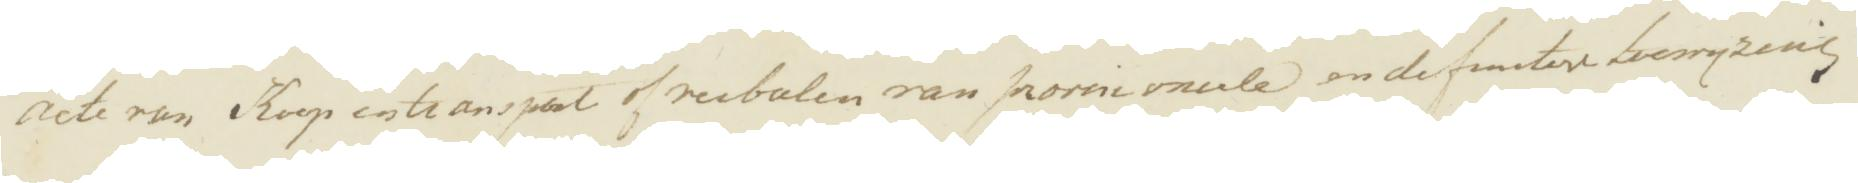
acte van Koop en transport of verbalen van provisioneele en definitive toewyzing
